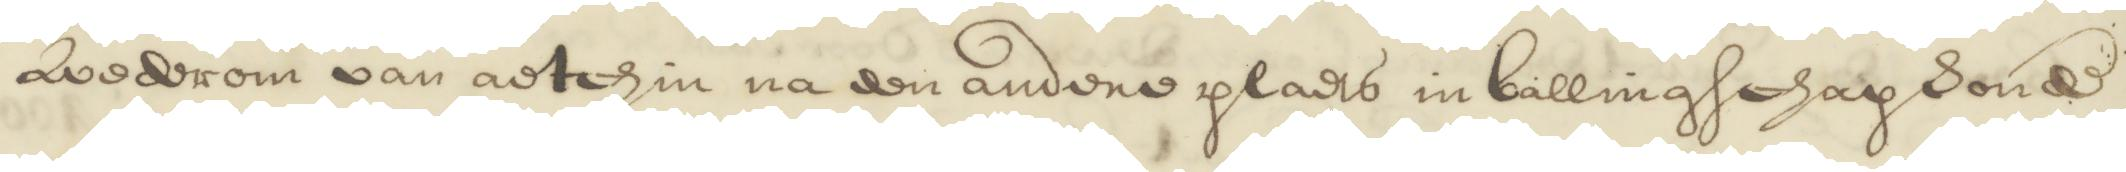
wederom van atchin na een andere plaets in ballingschap Soude
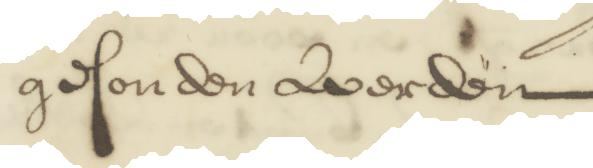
gesonden werden
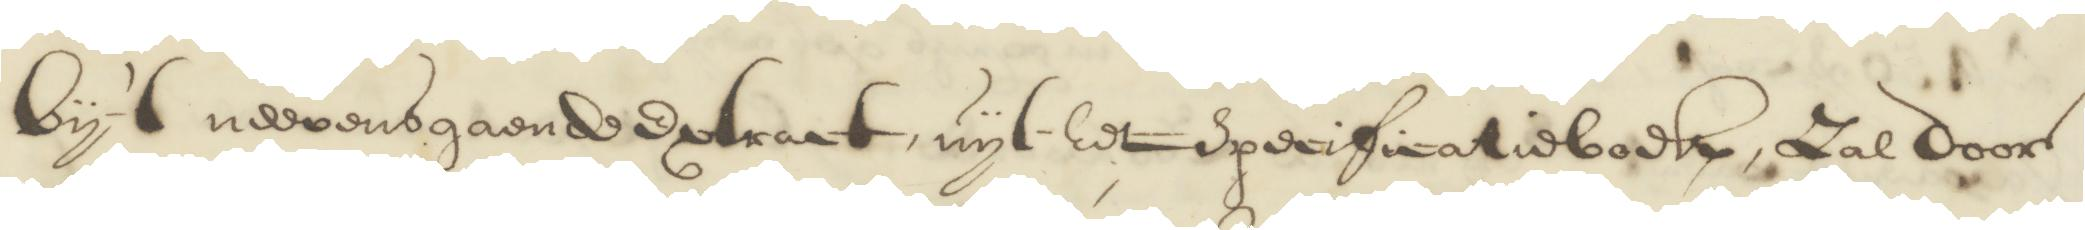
bij 't neevens gaende Extract, uijt het specificatie boek , Zal door
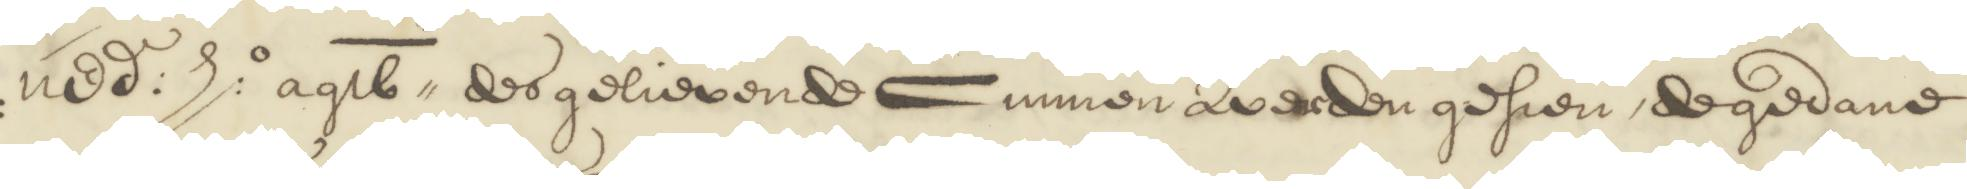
uEd:e h:o agtb„ des gelievende Cunnen werden gesien, de gedane
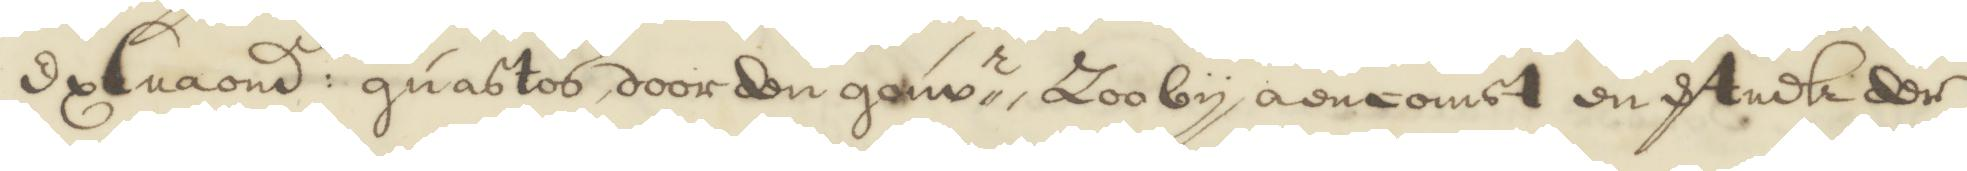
Extraord:e guastos, door den gouv„r, Zoo bij aencomst en vertrek der
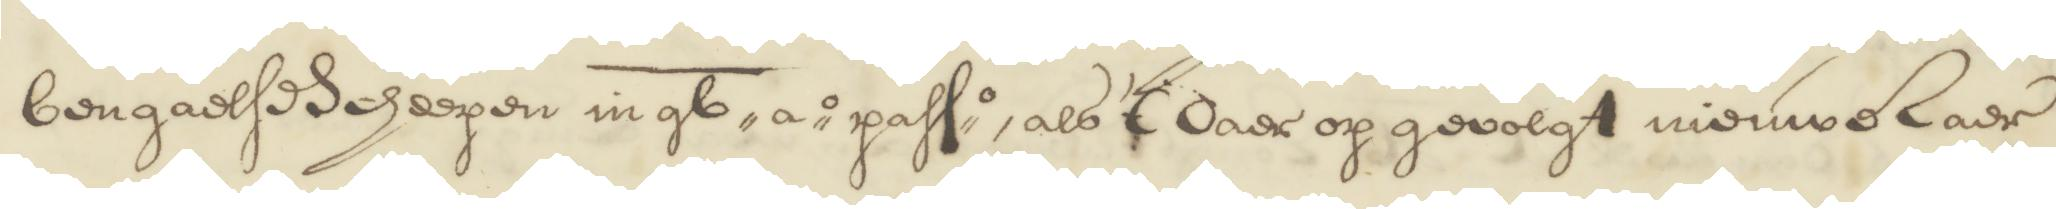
bengaelseScheepen in 9b„ a„o pass„o, als 't daer op gevolgt nieuwe Iaer
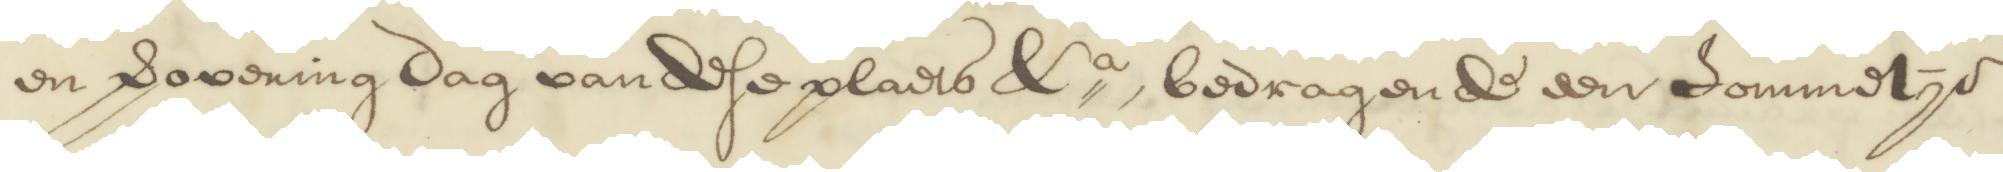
en verovering dag van dese plaets &„a, bedragende een sommetje
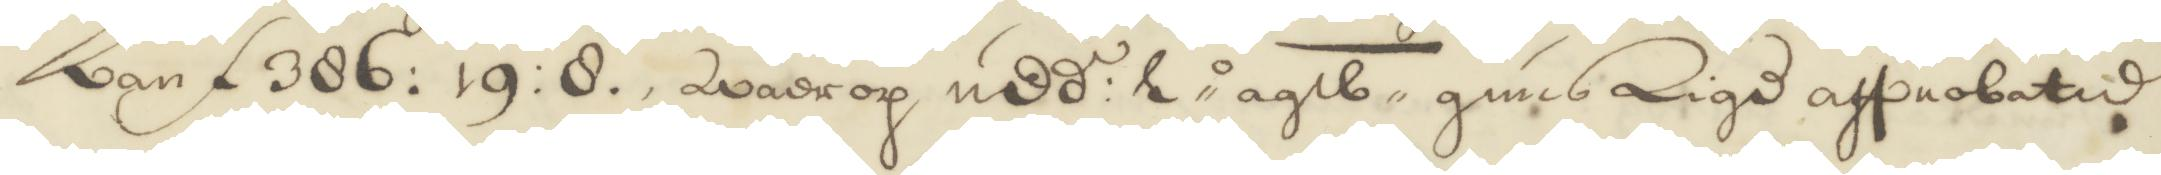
van ƒ386:19:8., waer op uEd: h„o agtb„ gunstige approbatie
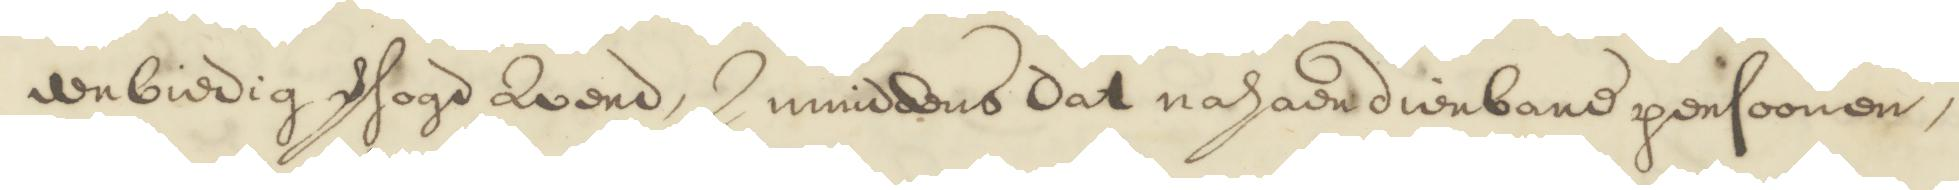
eerbiedig versogd werd, Inmiddens dat nahaer dierbare persoonen,
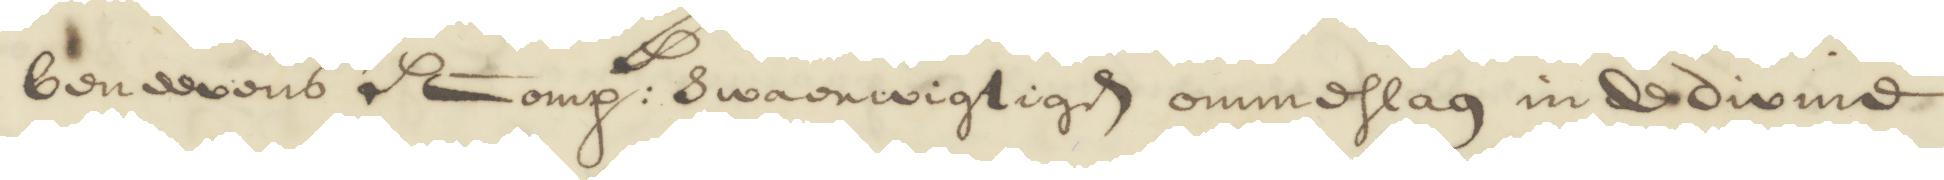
beneevens ’S Comp:s swaerwigtigen ommeslag in de divine
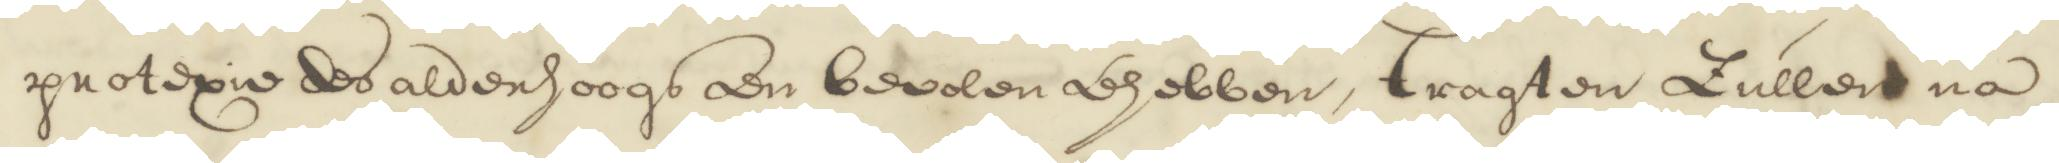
protexie des alderhoogsten bevolen tehebben, tragten Zullen na
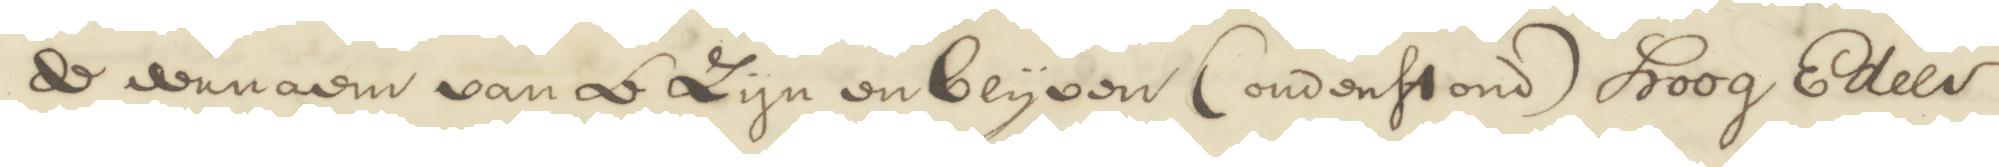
de eernaem van te Zijn en blijven (onderstond) Hoog Edele
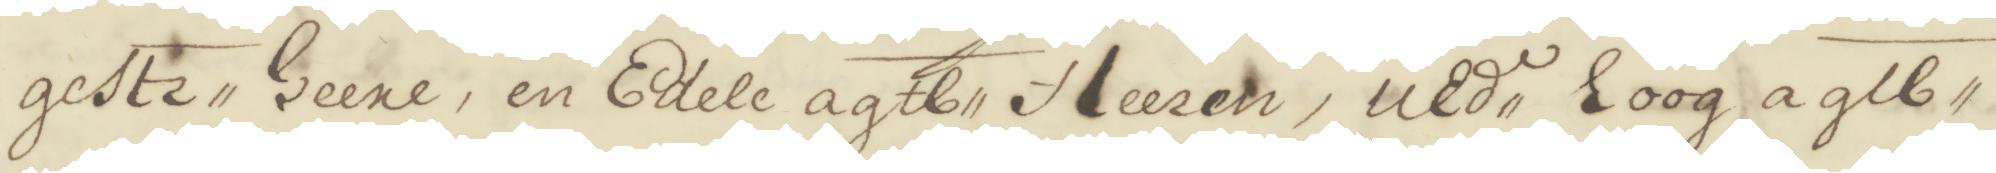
gestr„ Heere, en Edele agtb„ Heeren, uEd„e hoog agtb„
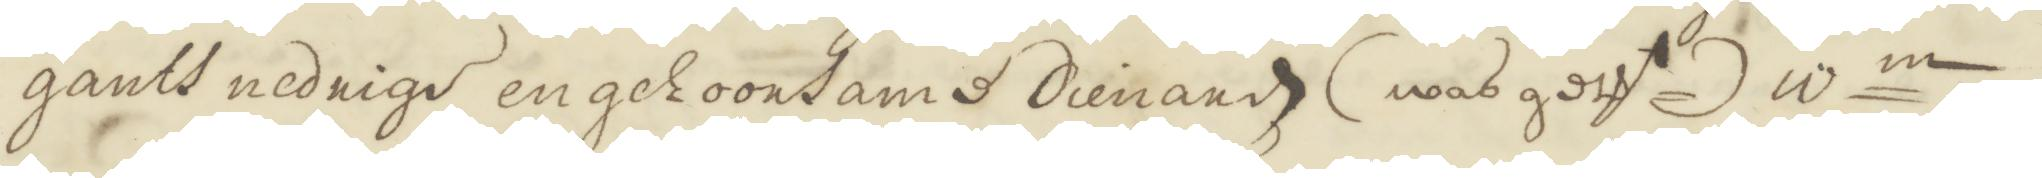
gants nedrige en gehoorsam e dienaren (was gete=t) w=m
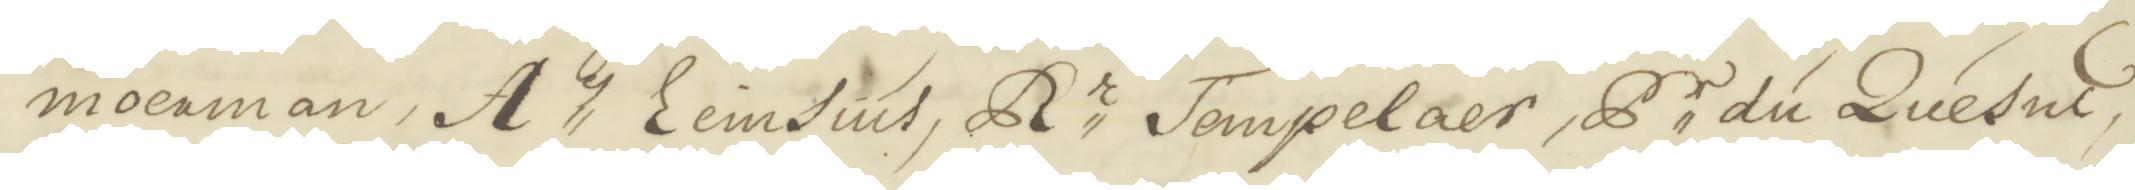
moerman, A„y heinsuis, R„r Tempelaer, P„r du Quesue,
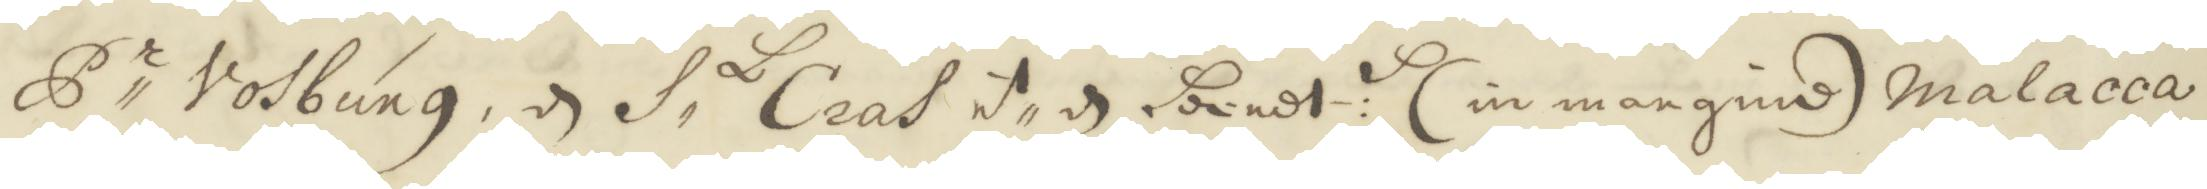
P„r Vosburg, en S„l Cras r„t en Secret:s (in margine) malacca
